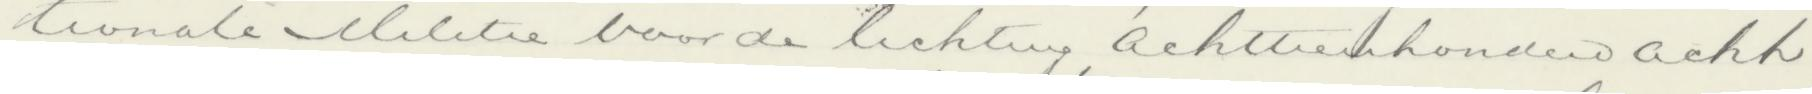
tionale Militie voor de lichting Achttienhonderd acht
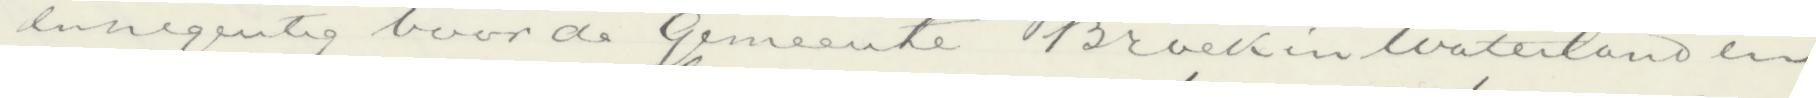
ennegentig voor de Gemeente Broek in waterland en
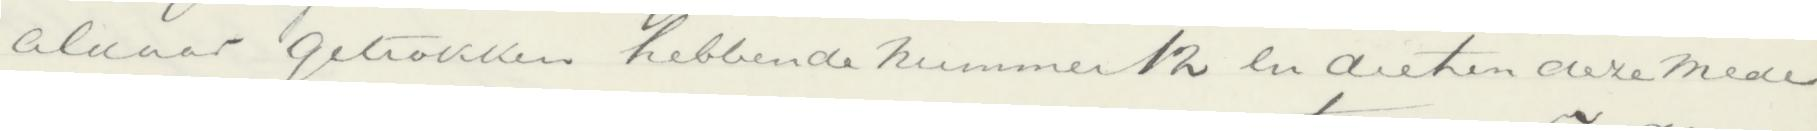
aldaar getrokken hebbende nummer 12 en dieten deze mede
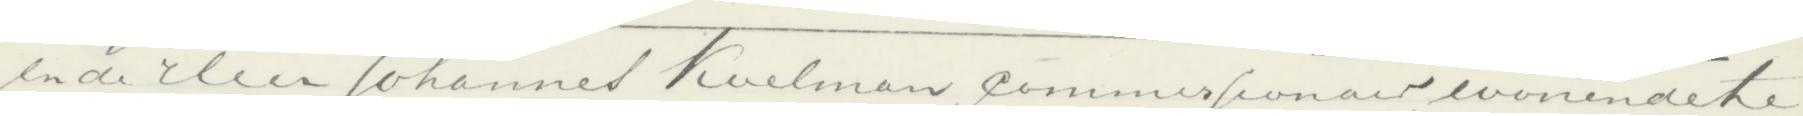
en de Heer Johannes Koelman commissionair, wonende te
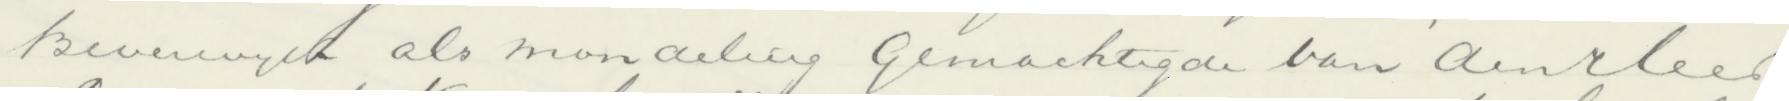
Beverwyck als mondeling Gemachtigde van den Heer
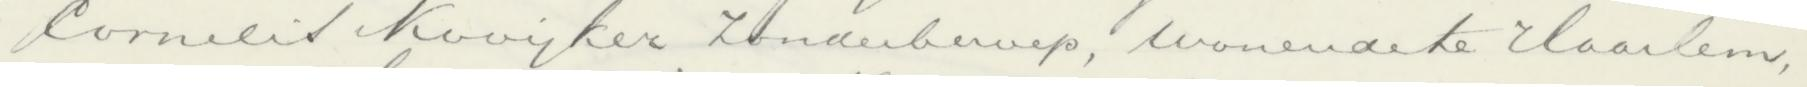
Cornelis Kooijker zonderberoep, wonende te Haarlem,
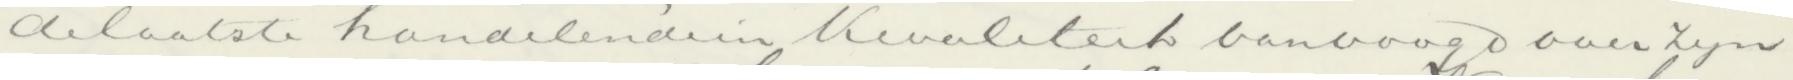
de laatste handelende in kwaliteit van voogd van zyn
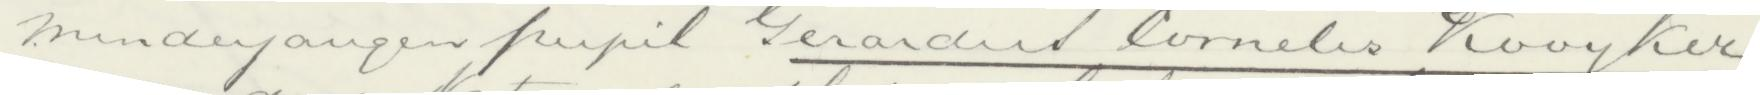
minderjarigen pupil Gerardus Cornelis Kooyker
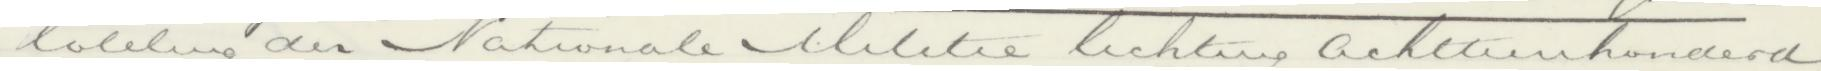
loteling der Nationale Militie lichting achttienhonderd
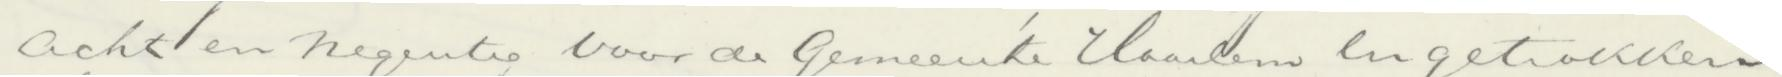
acht en negentig voor de Gemeente Haarlem en getrokken
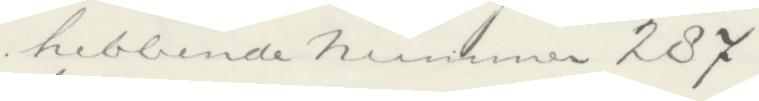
hebbende Nummer 287
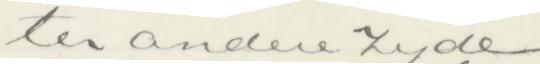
ten andere zyde
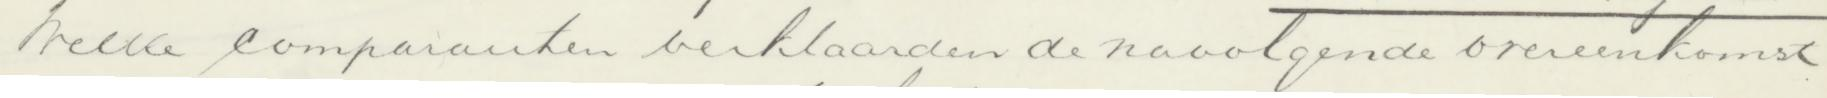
Welke comparanten verklaarden de navolgende overeenkomst
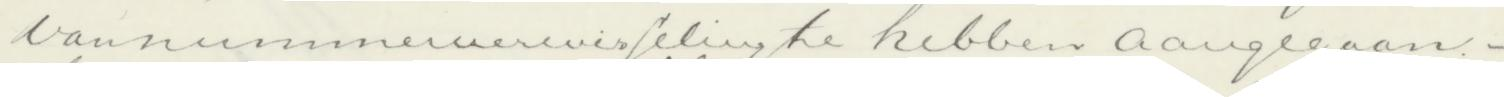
van nummerverwisseling te hebben aangegaan
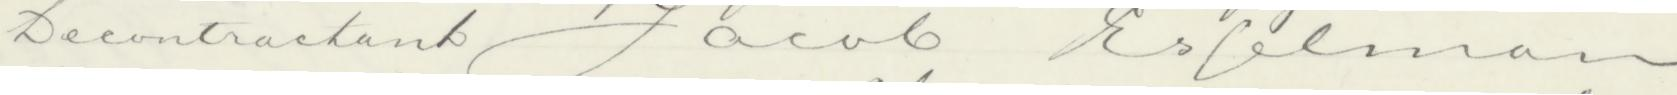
De contractant Jacob Escelman
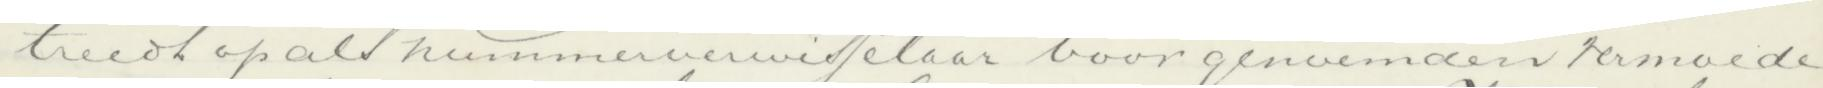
treedt op als nummerverwisselaar voor genoemden vermoede
